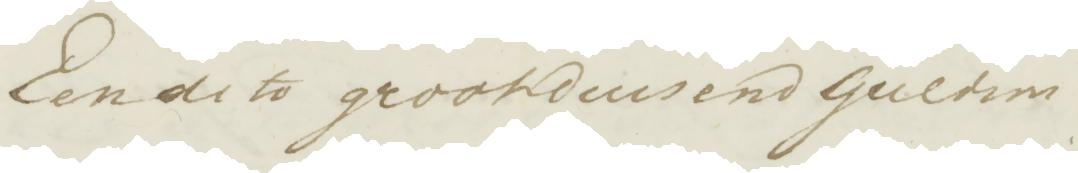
Een dito groot duisend guldens
